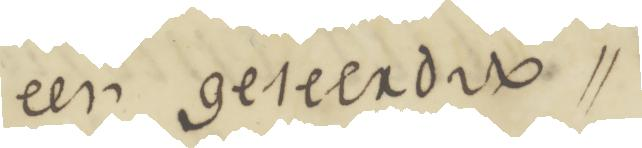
een geteerde „
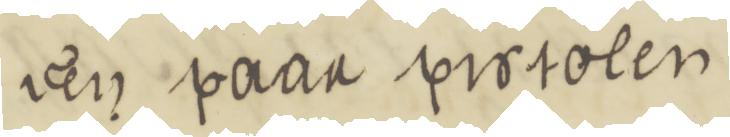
Een paar pistolen
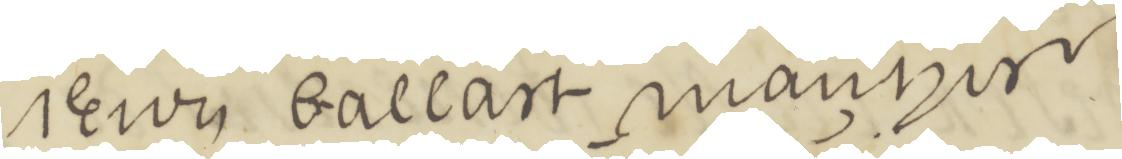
thien ballast mantjis
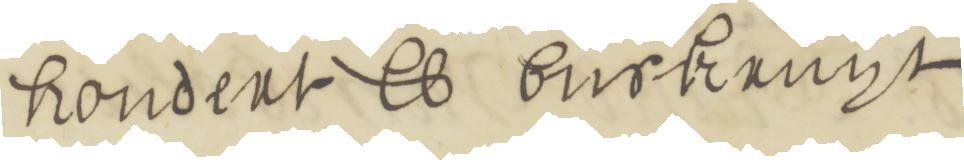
hondert lb buskruijt
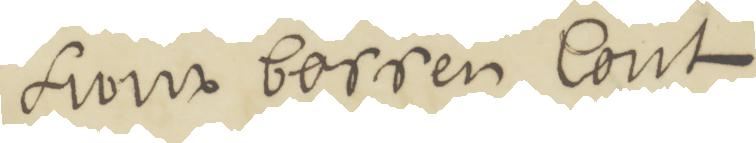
twee bossen lont
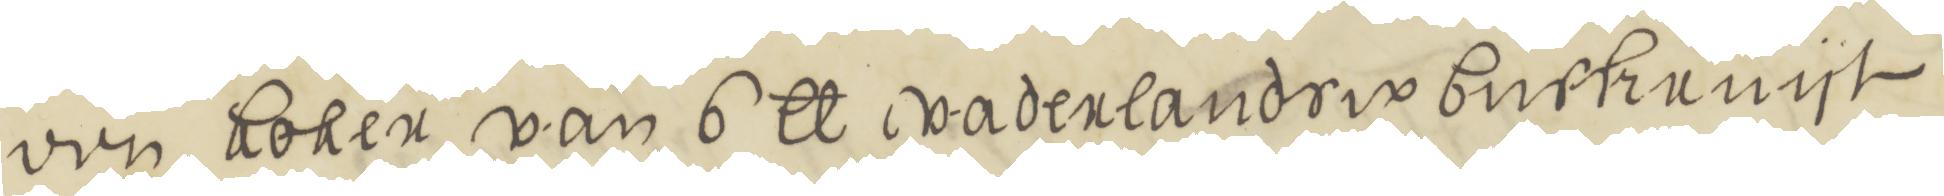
een koker van 6 lb vaderlandse buskruijt
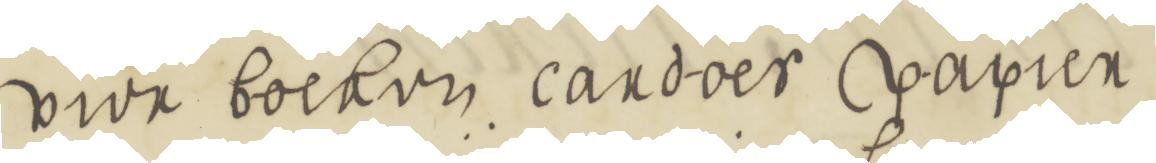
vier boeken cardoes papier
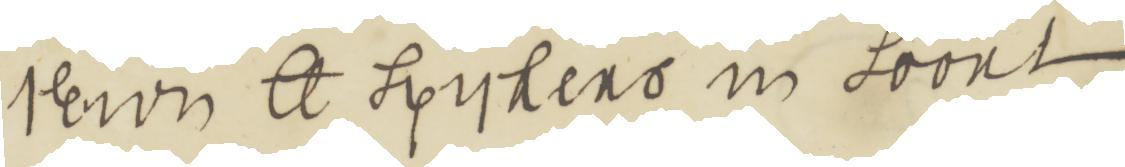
thien lb spijkers in soort
